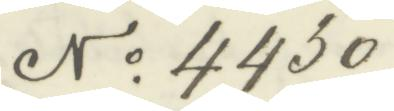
N.o 4430
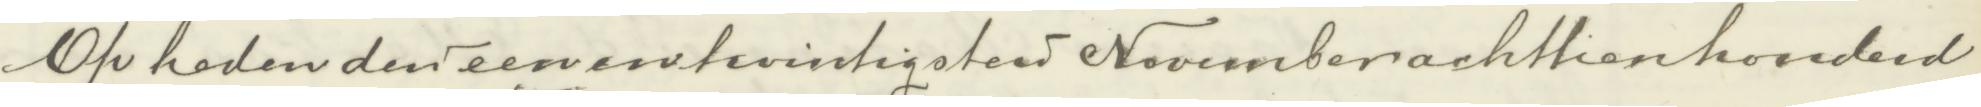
Op heden den een en twintigsten November achttienhonderd
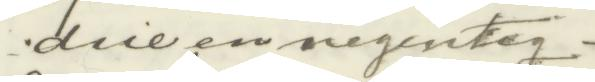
drie en negentig.
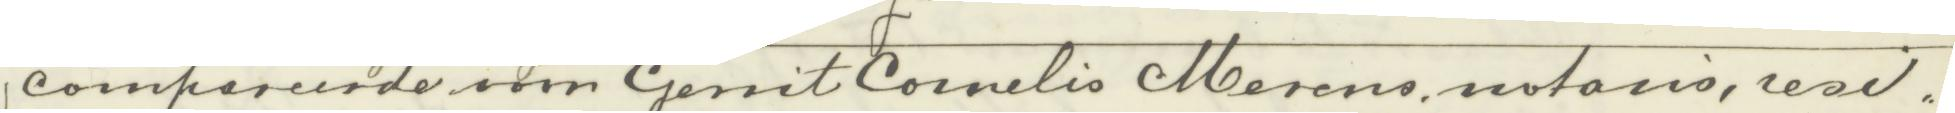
compareerde voor Gerrit Cornelis Merens, notaris, resi„
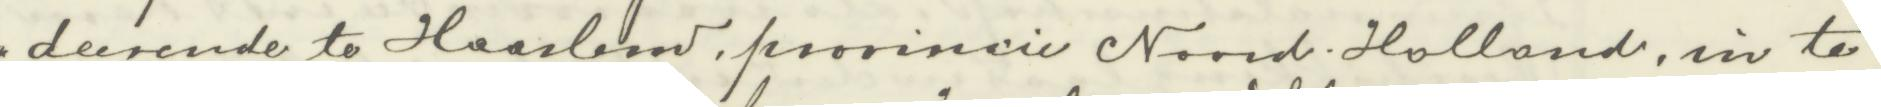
„deerende te Haarlem, provincie Noord.Holland, in te
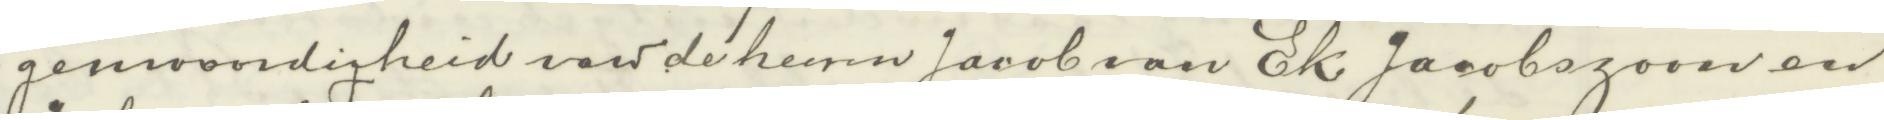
genwoordigheid van de heren Jacob van Ek Jacobszoon en
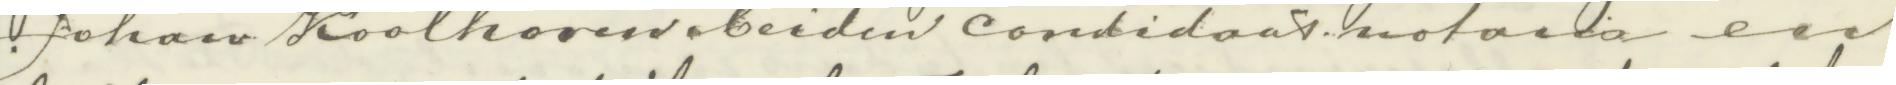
Johan Koolhoven beiden Candidaat-notaris en
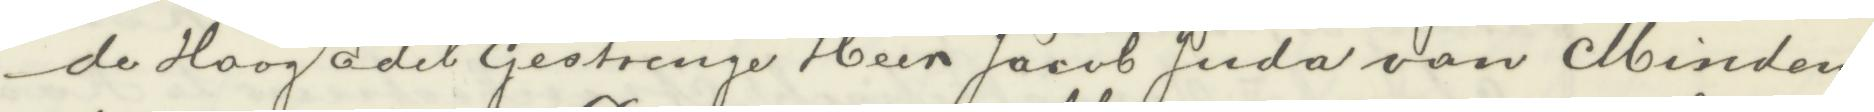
de Hoog Edel Gestrenge Heer Jacob Juda van Minden
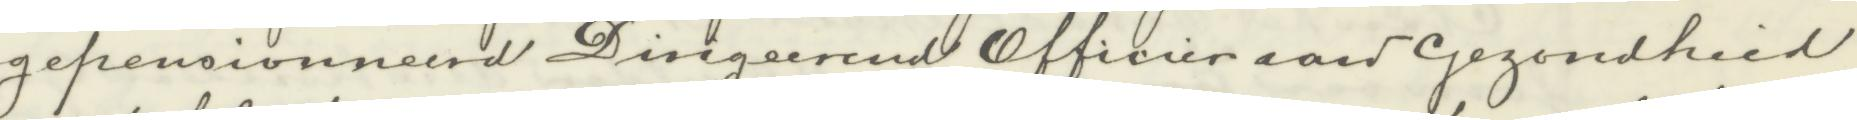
gepensionneerd Dirigeerend Officier van Gezondheid
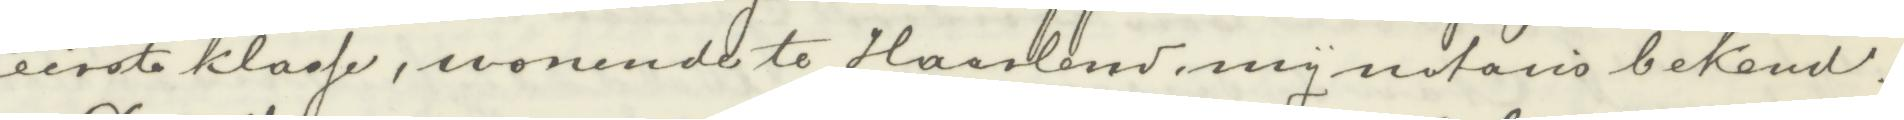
eerste klasse, wonende te Haarlem, mij notaris bekend.
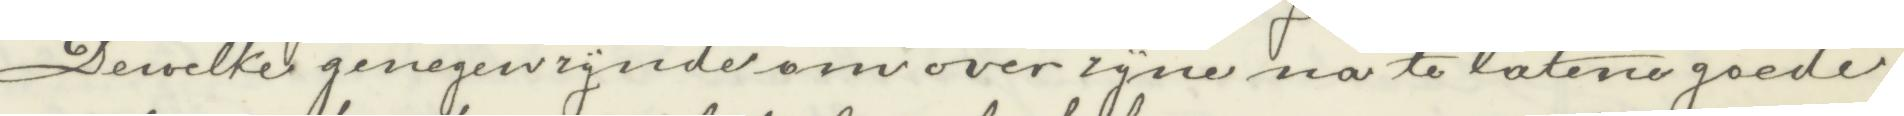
Dewelke genegen zijnde om over zijne na te latene goede
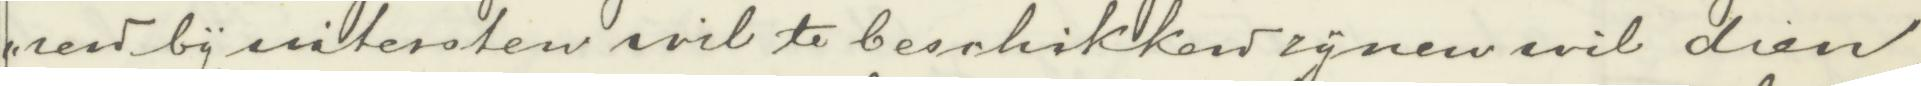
„ren bij uitersten wil te beschikken zijnen wil dien
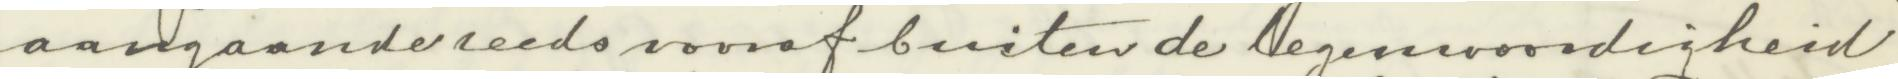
aangaande reeds vooraf buiten de tegenwoordigheid
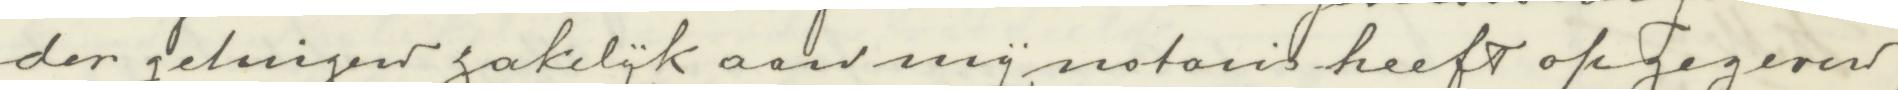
der getuigen zakelijk aan mij notaris heeft opgegeven
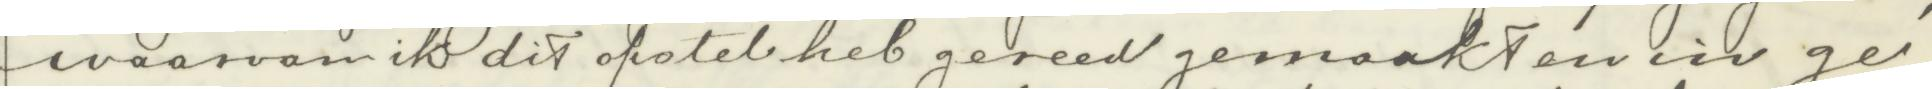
waarvan ik dit opstel heb gereed gemaakt en in ge
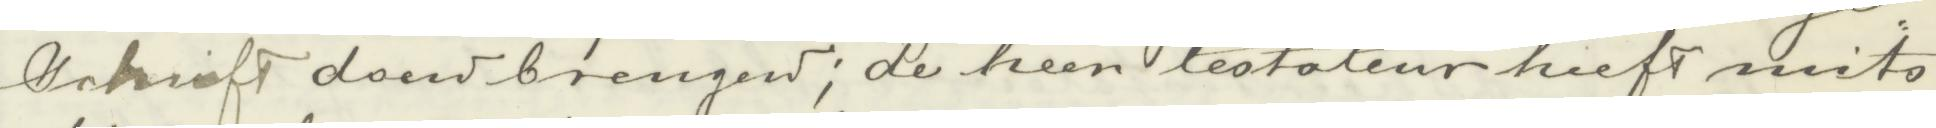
schrift doen brengen; de heer testateur heeft mits
